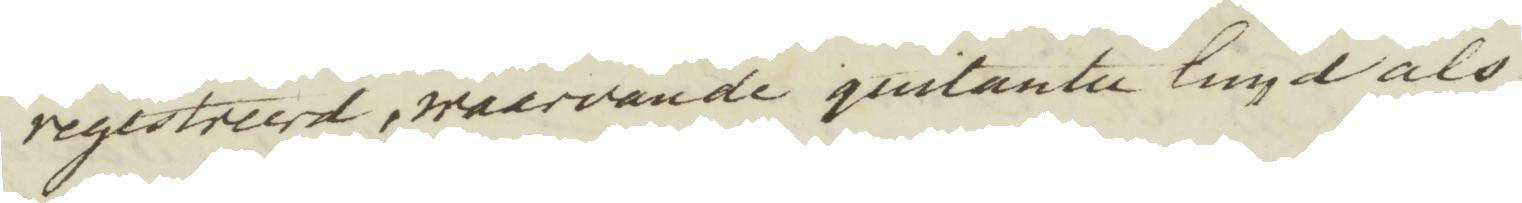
registreerd, waarvan de quitantie luyd als
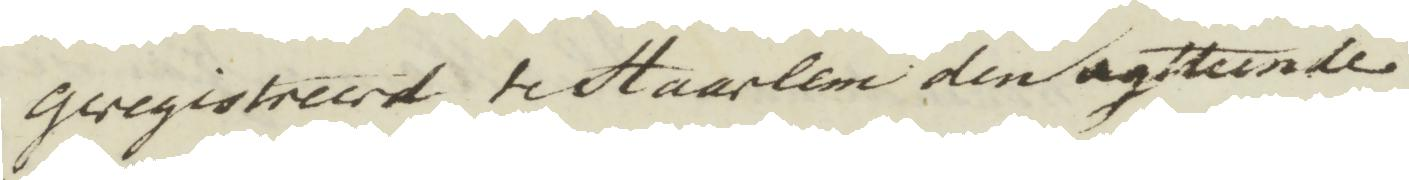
geregistreerd te Haarlem den agttiende
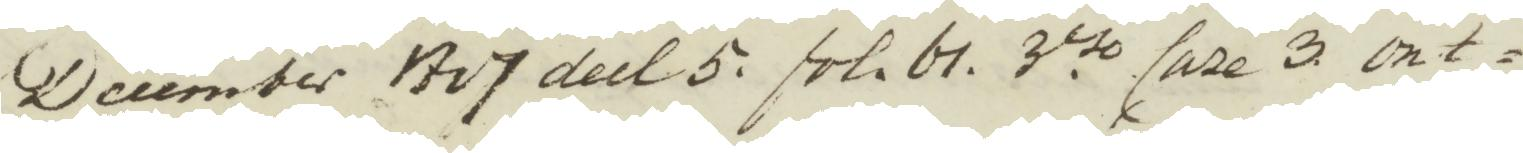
December 1817 deel 5. fol. 61. 3.vso Caze 3. ont=
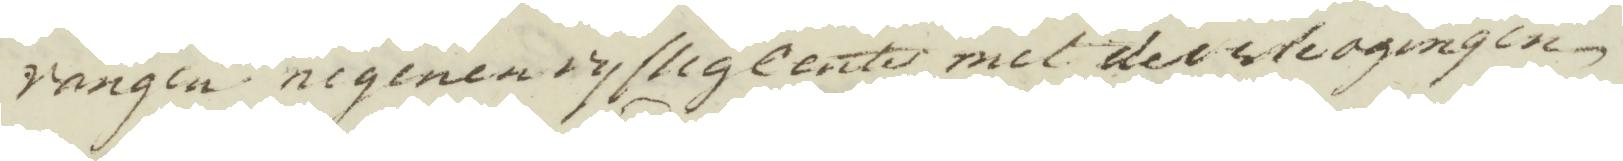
vangen negenen vyftig cents met de verhogingen-
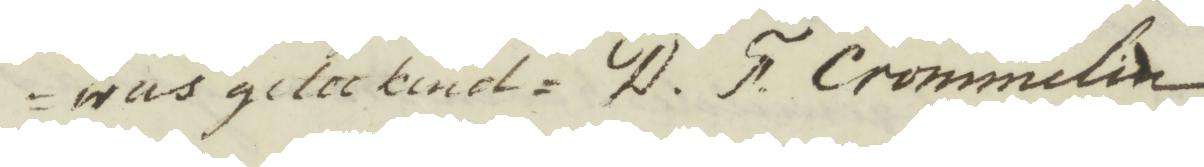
=was geteekend= D. F. Crommelin
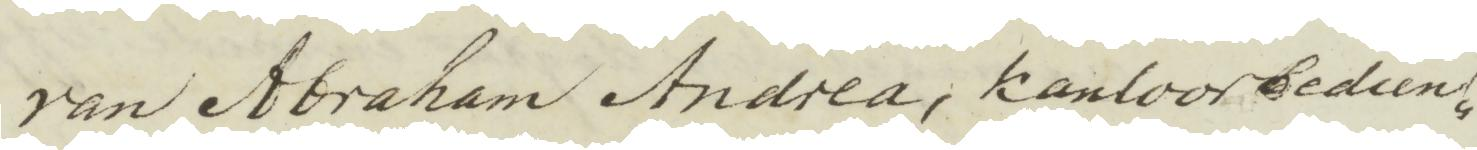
van Abraham Andrea, kantoor bedien„
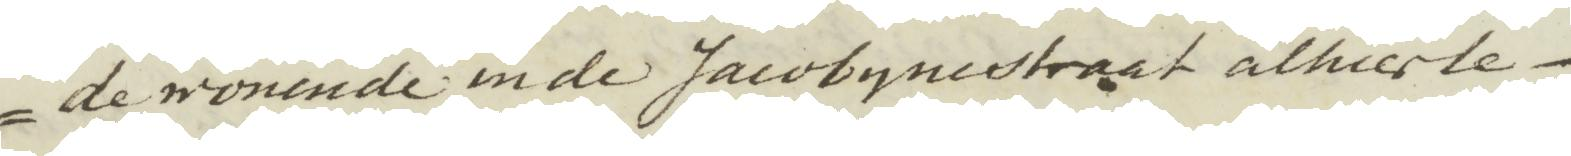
=de wonende in de Jacobynestraat alhier le -
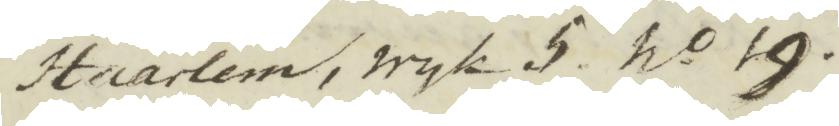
Haarlem, wyk 5. N=o 19.
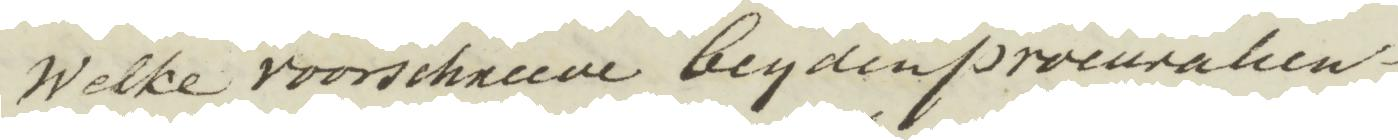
Welke voorschreeve beyden procuratien
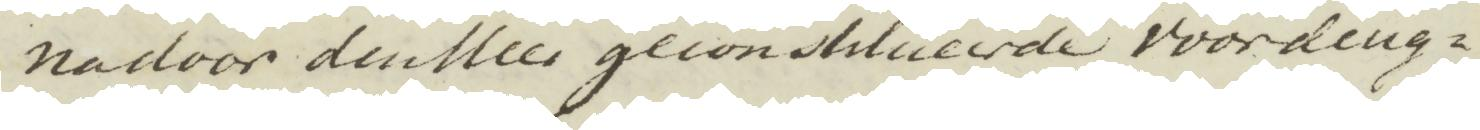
na door denHeer geconstitueerde voordeug=
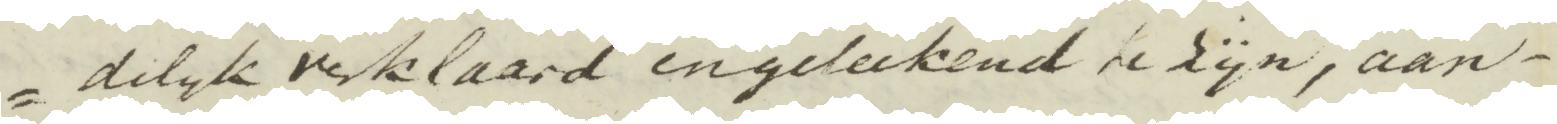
=dilyk verklaard en geteekend te zijn, aan -
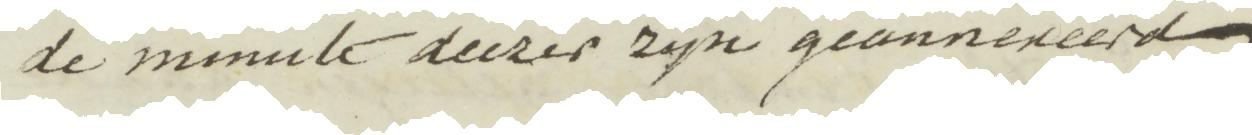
de minute deezer zijn geannexeerd.
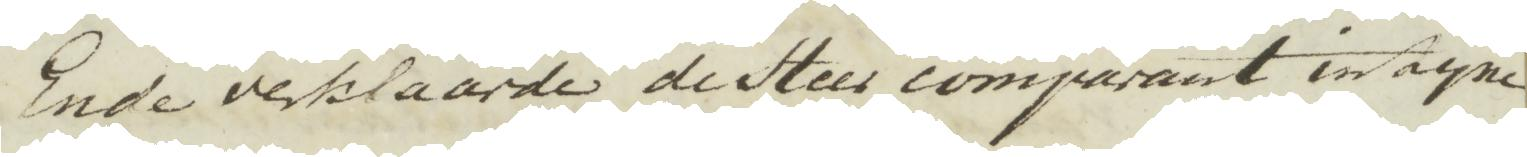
Ende verklaarde de Heer comparant in zijne
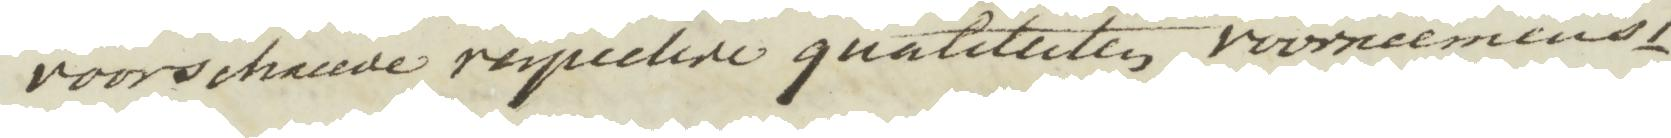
voorschreeve respective qualiteiten voorneemens
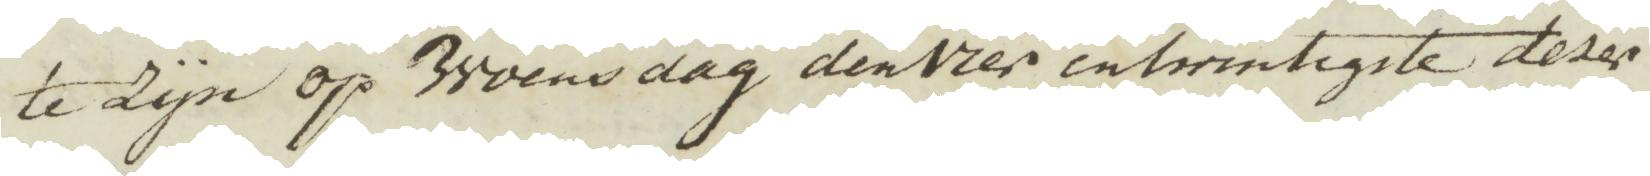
te zijn op Woensdag den Vier entwintigste dezer
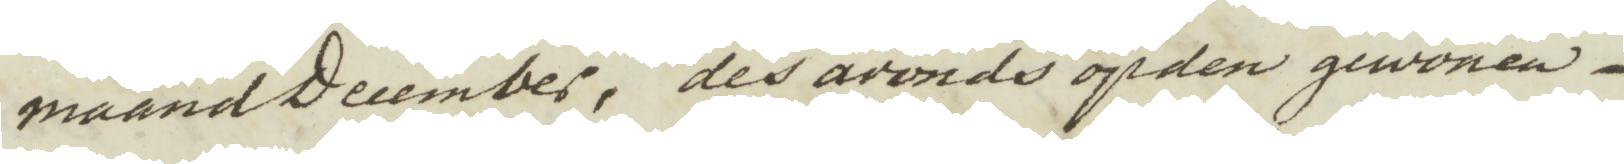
maand December, des avonds opden gewonen-
